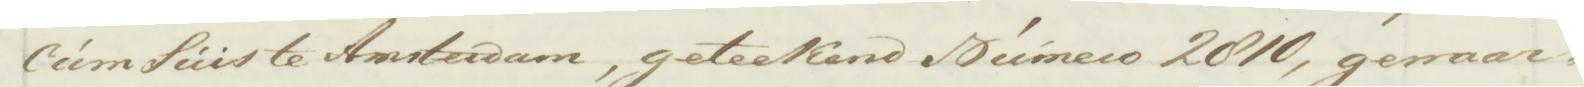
cum suis te Amsterdam, geteekend Numero 2810, gewaar„
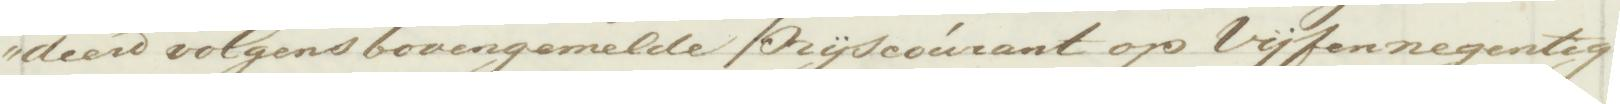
„deerd volgens bovengemelde Prijscourant op Vijfennegentig
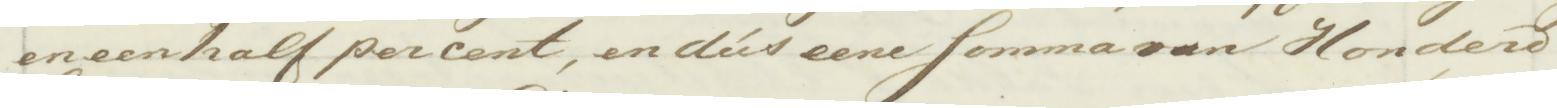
en een half percent, en dus eene somma van Honderd
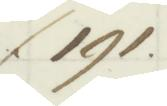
ƒ 191.
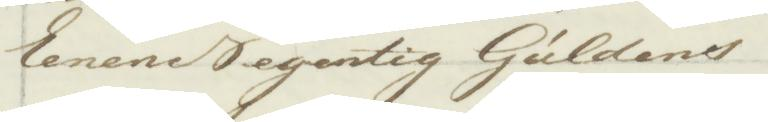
EenenNegentig Guldens
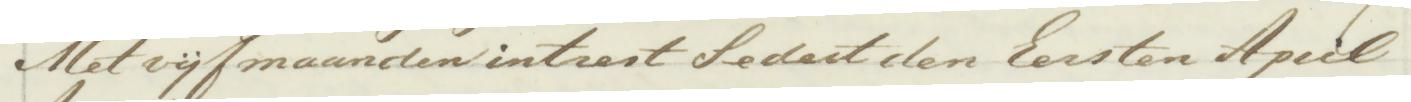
Met vijf maanden intrest sedert den Eersten April
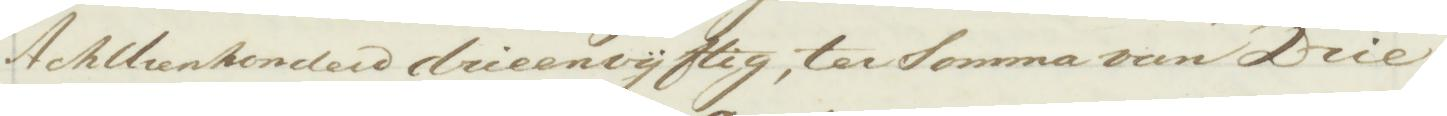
Achttienhonderd drieenvijftig, ter somma van Drie
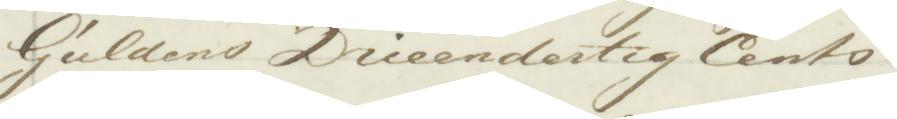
Guldens Drieendertig Cents
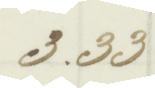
3.33
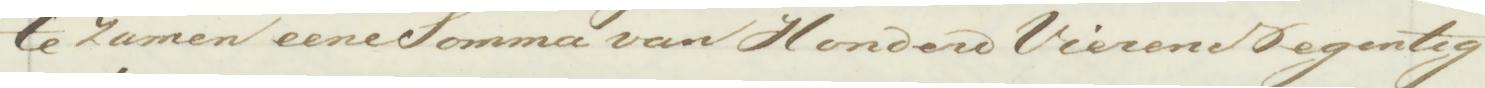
te zamen eene somma van Honderd Vieren Negentig
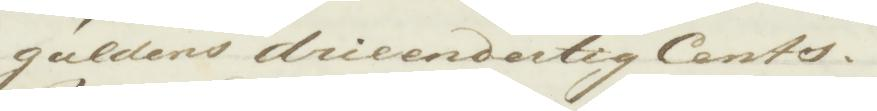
guldens drieendertig Cents.
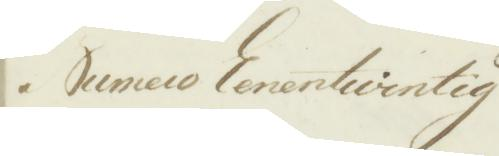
„ Numero Eenentwintig
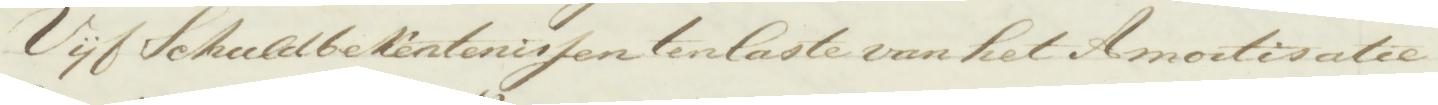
Vijf Schuldbekentenissen ten laste van het Amortisatie
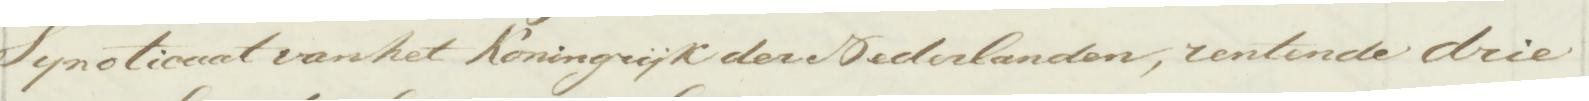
Synoticaat van het Koningrijk der Nederlanden, rentende drie
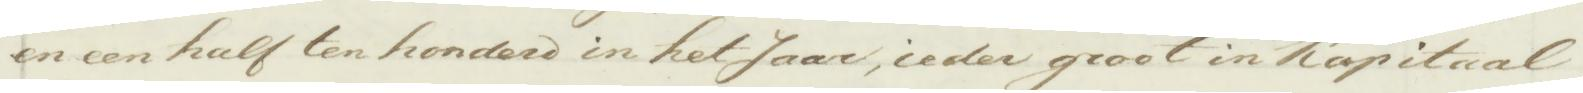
en een half ten honderd in het Jaar, ieder groot in kapitaal
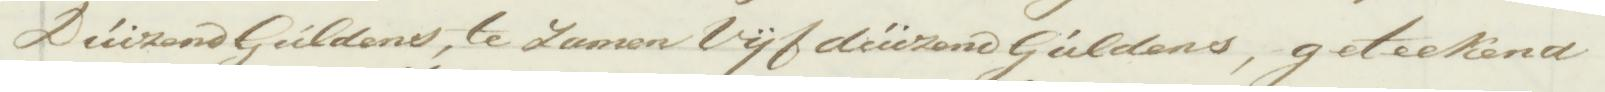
Duizend Guldens, te zamen Vijf duizend Guldens, geteekend
